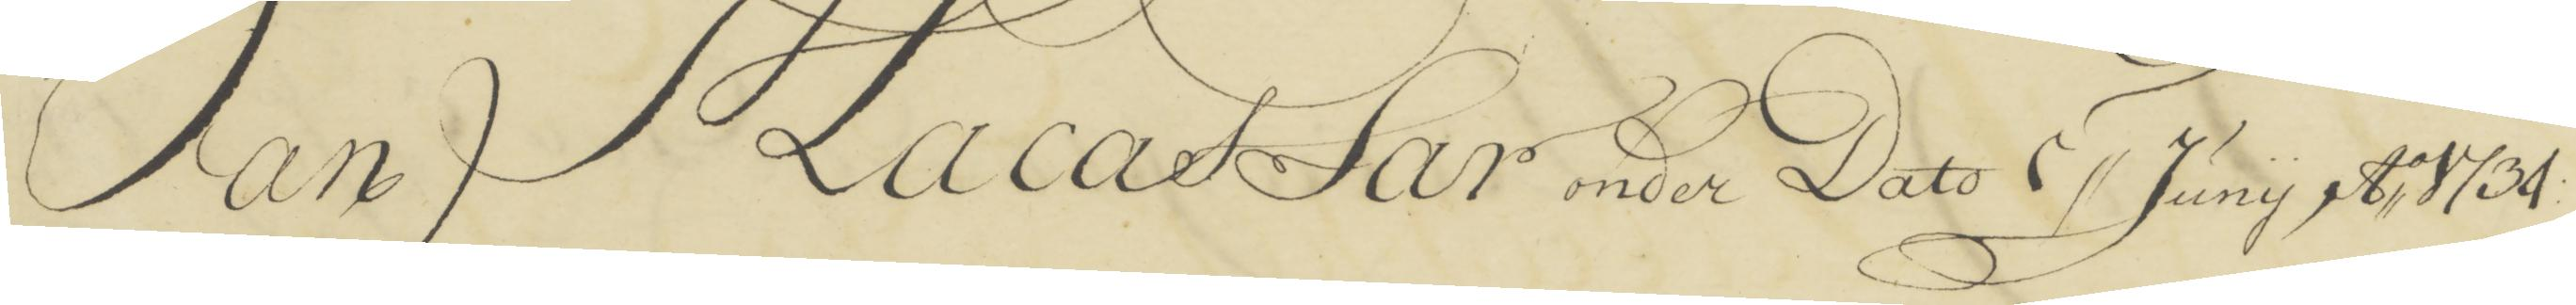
Van Macassar onder Dato 5„' Junij A„o 1734:
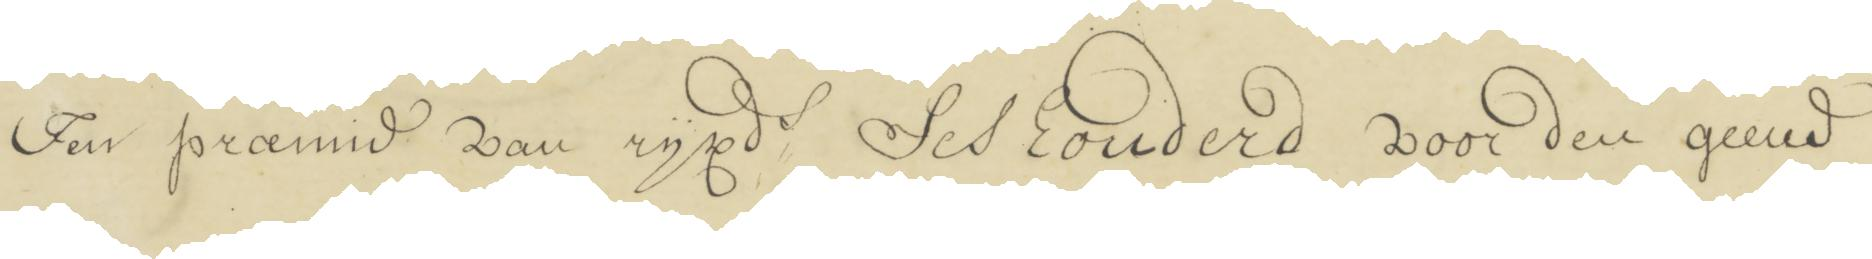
Een praemie van rijxd:s ses honderd voor den geene
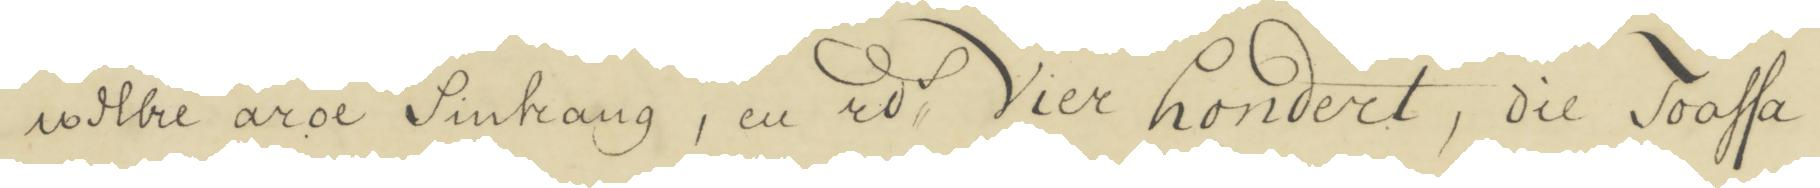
welke aroe sinkang, en rd„s Vier hondert, die Toassa
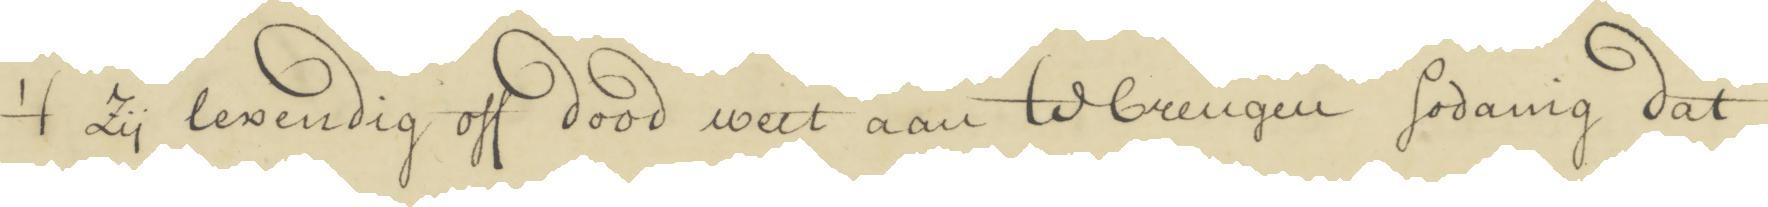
't zij levendig off dood weet aan te brengen sodanig dat
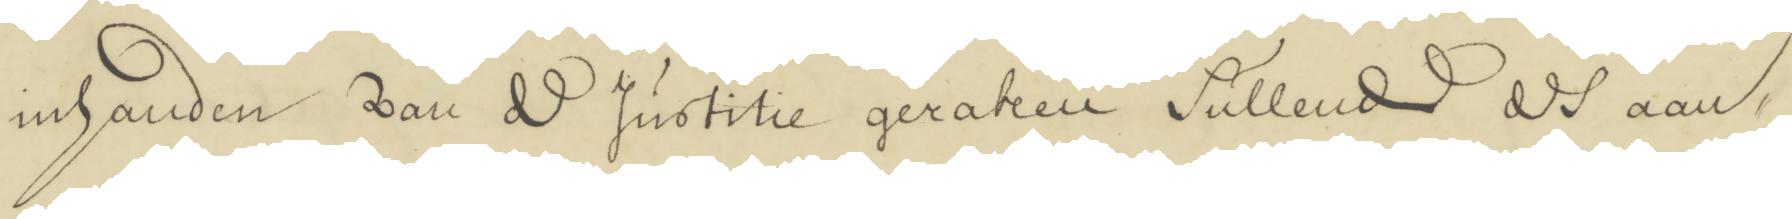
inhanden van de Justitie geraken sullende des aan„
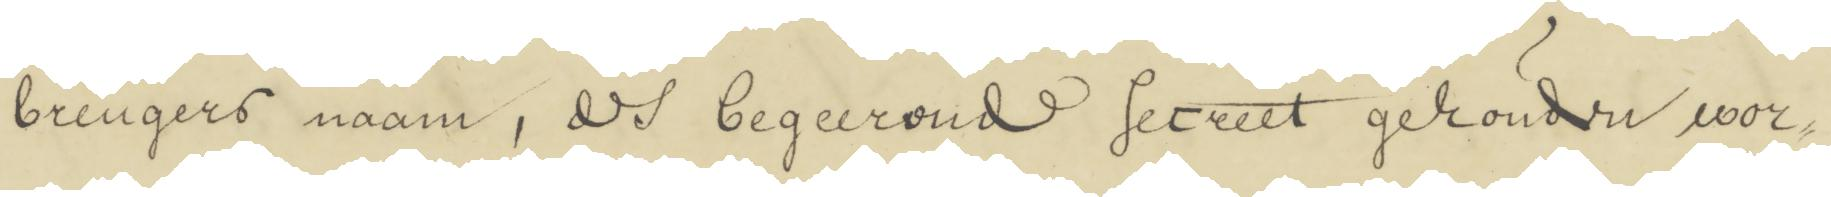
brengers naam, des begeeronde secreet gehouden wor„
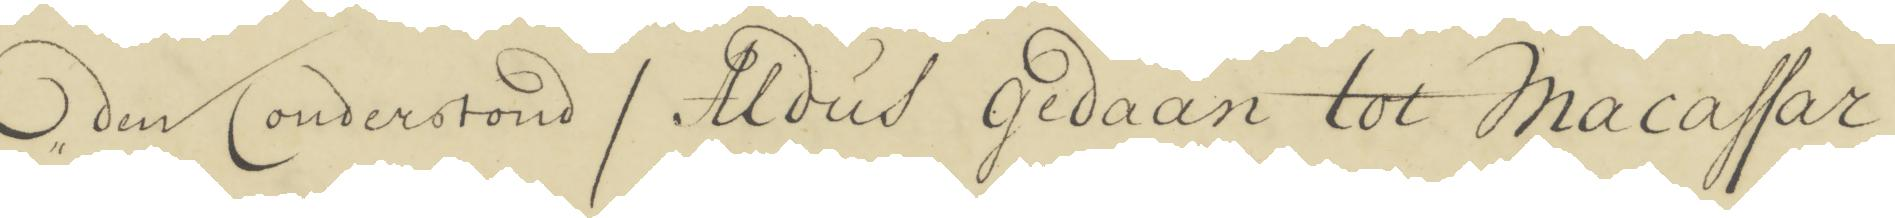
„den (onderstond / Aldus gedaan tot Macassar
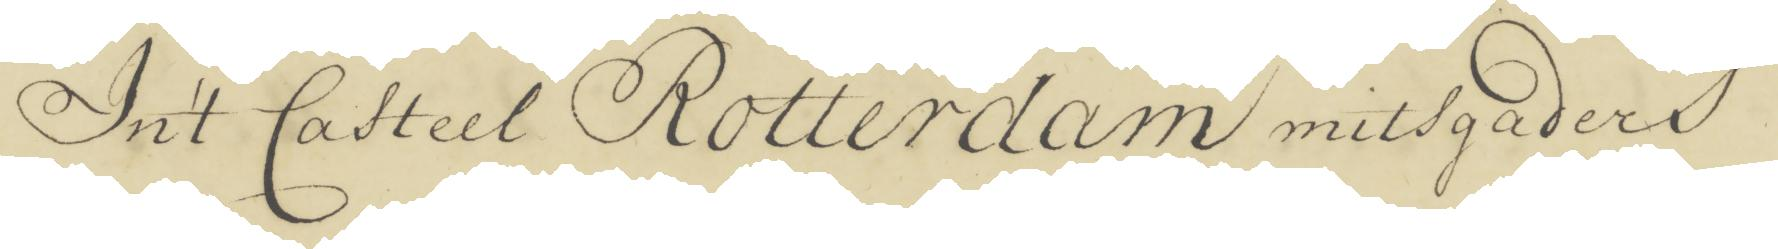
In’t Casteel Rotterdam mitsgaders
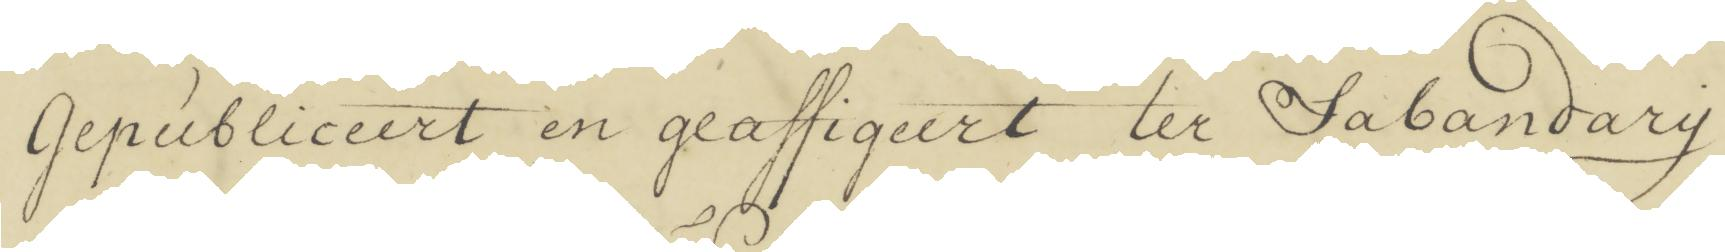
gepubliceert en geaffigeert ter Sabandarij
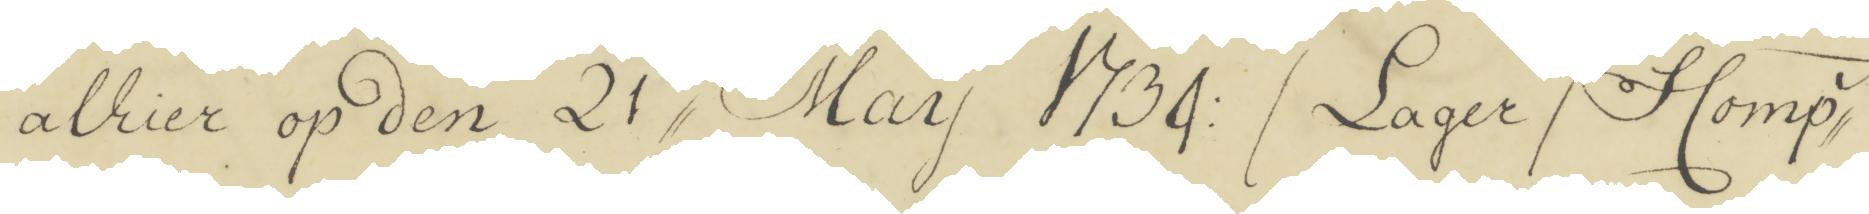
alhier op den 21„' Maij 1734: / Lager / SComp„s
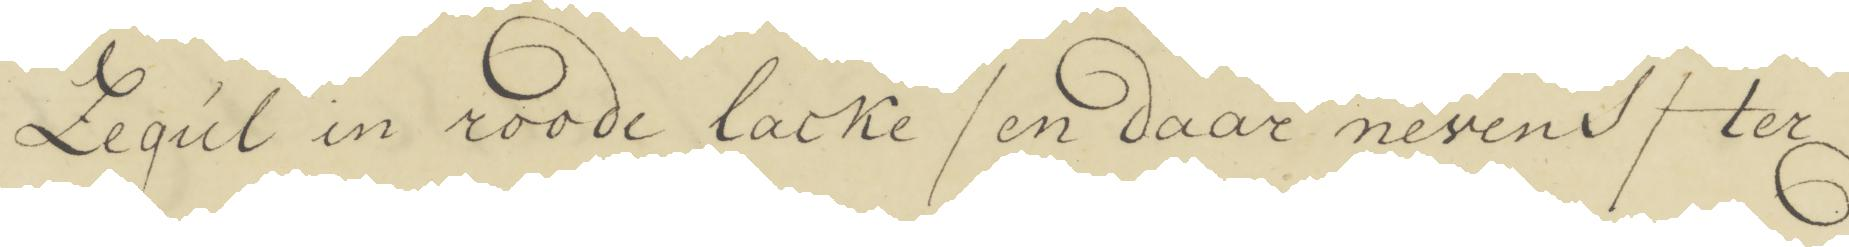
zegul in roode lacke / en daar nevens / ter
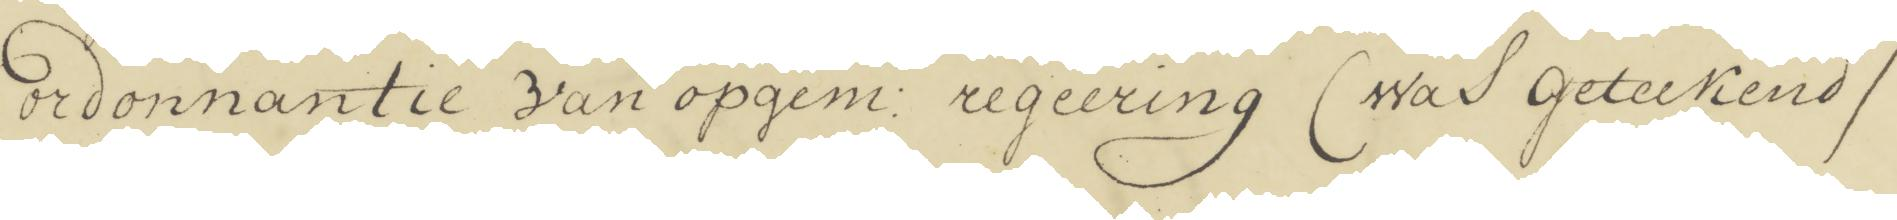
ordonnantie van opgem: regeering ( was geteekend /
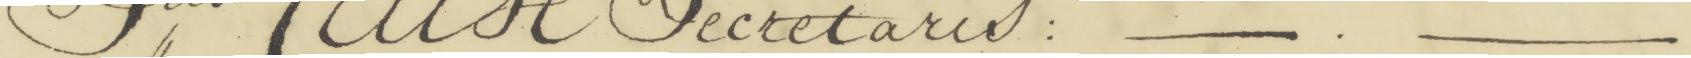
I„us Cruse Secretaris: — . —
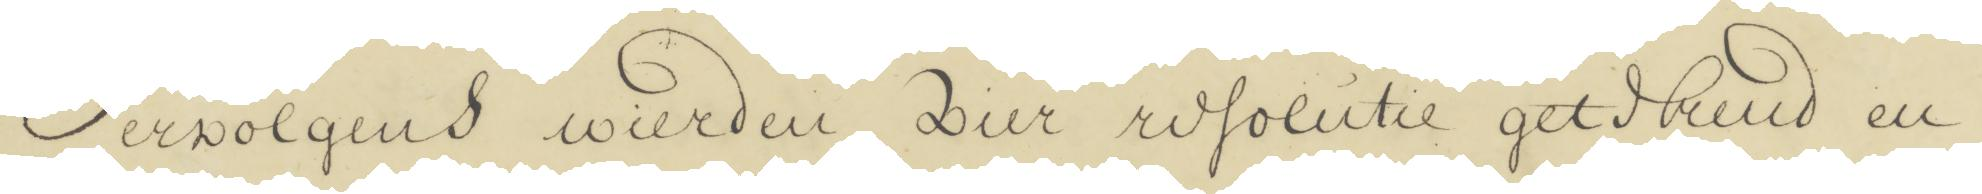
Vervolgens wierden vier resolutie getekend en
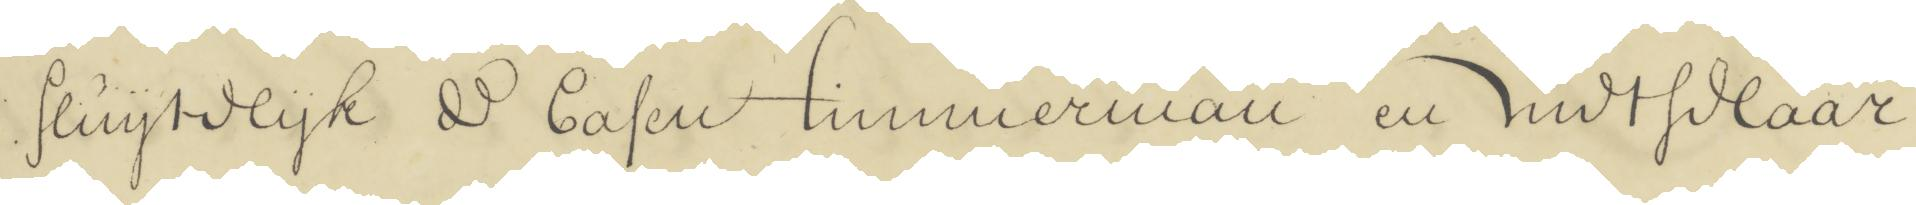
sluijtelijk de basen timmerman en metselaar
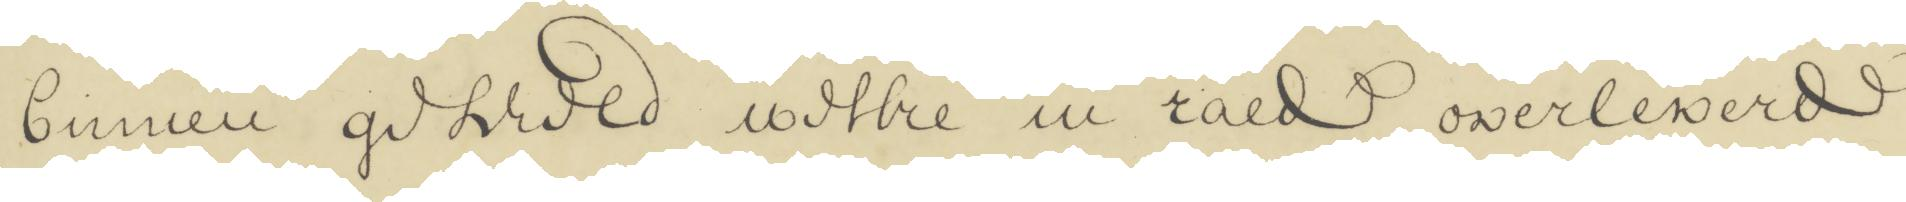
binnen gescheld welke in raede overleverde
